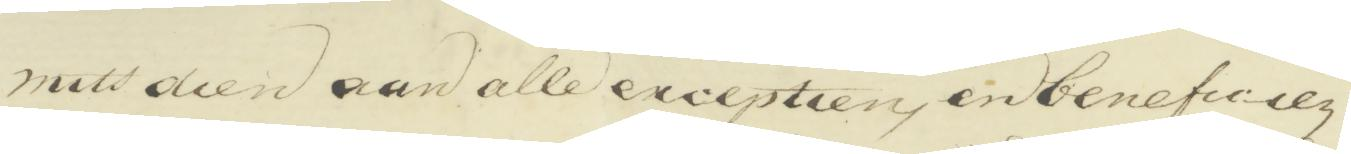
mits dien aan alle exceptien, en beneficien
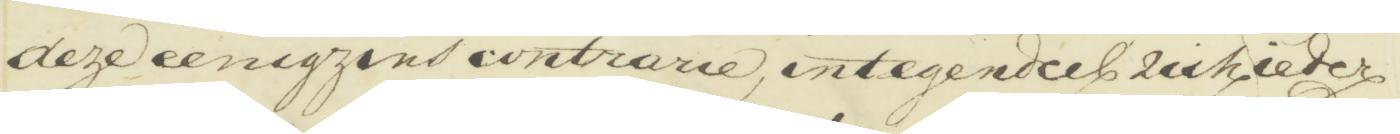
deze eenigzins contrarie, integendeel zich ieder
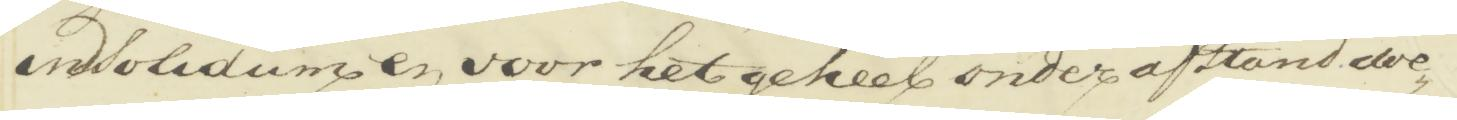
insolidum en voor het geheel onder afstand doe„
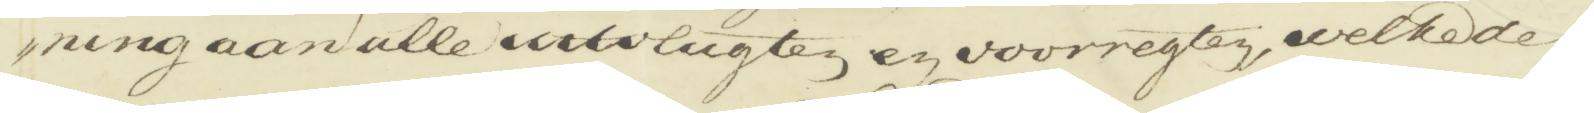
„ning aan alle uitvlugten en voorregten, welke de
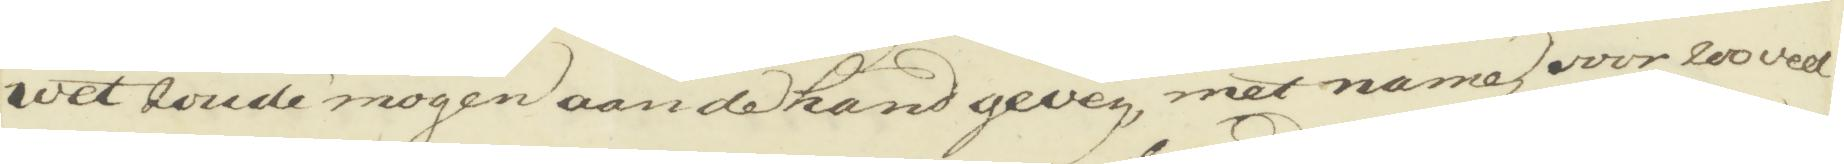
wet zoude mogen aan de hand geven, met name voor zoo veel
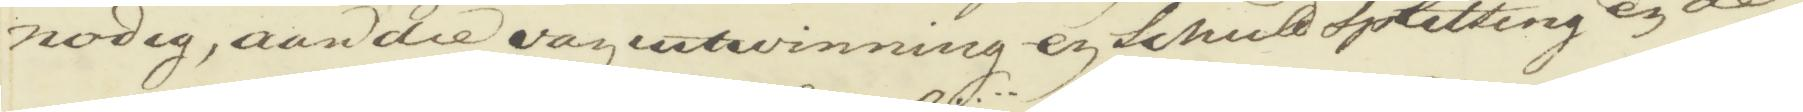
nodig, aan die van uitwinning en schuldsplitsing en de
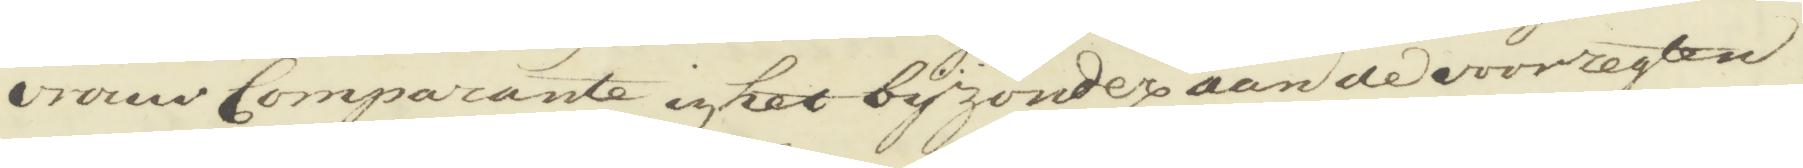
vrouw Comparante in het bijzonder aan de voorregten
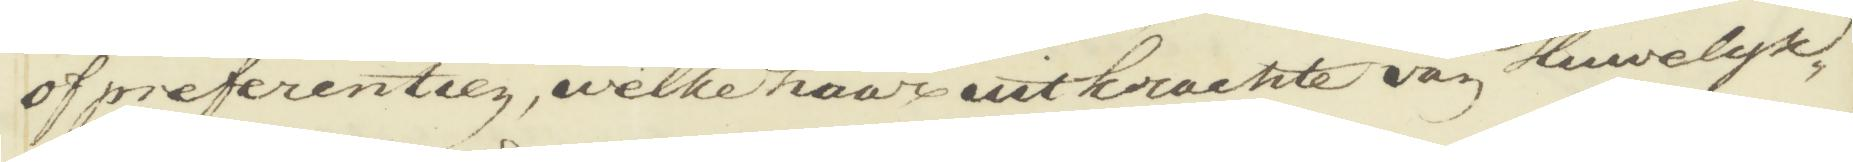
of preferentien, welke haar uit krachte van Huwelyk„
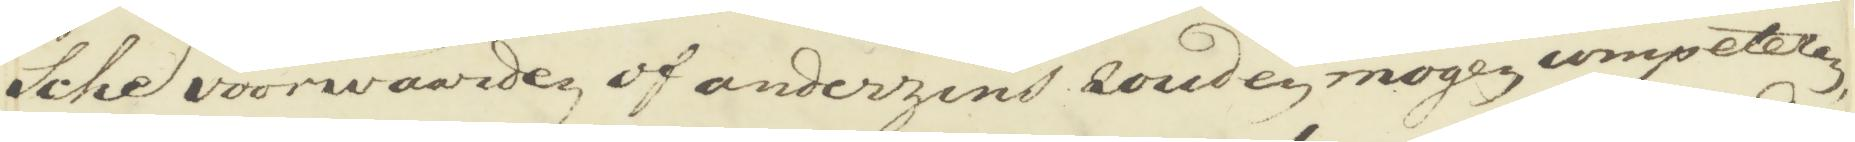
sche voorwaarden of anderzins zouden mogen competeren,
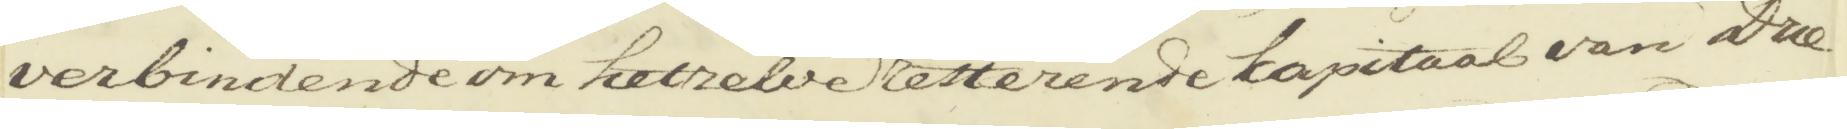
verbindende om hetzelve resterende kapitaal van Drie
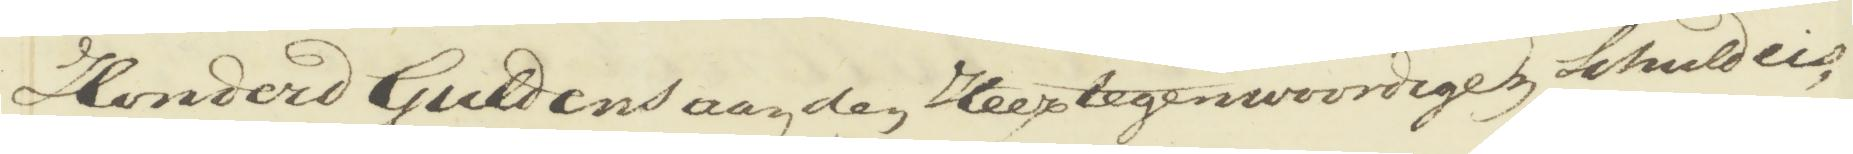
Honderd Guldens aan den Heer tegenwoordigen schuldeis
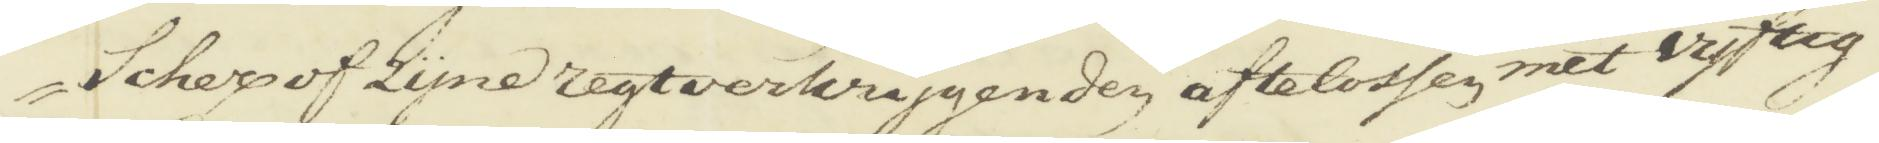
„scher of zijne regt verkrygenden aftelossen met vyftig
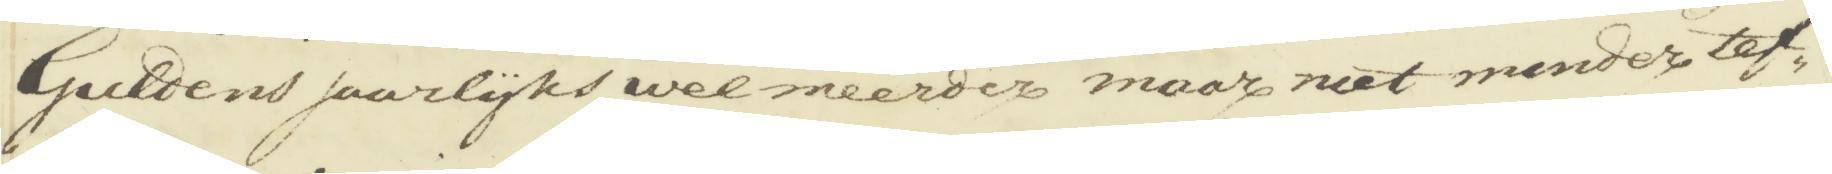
Guldens jaarlijks wel meerder maar niet minder tef„
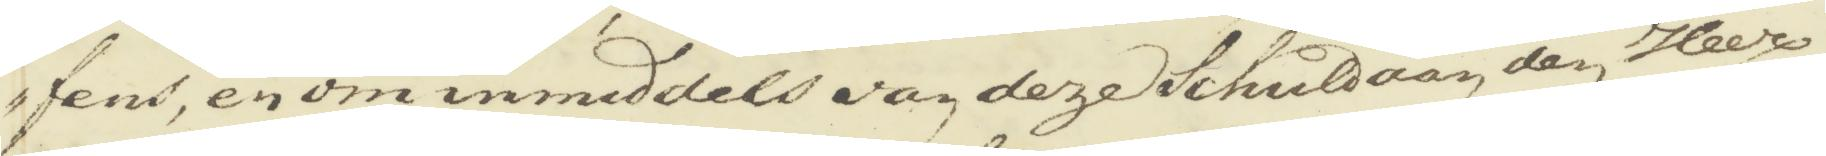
„fens, en om inmiddels van deze schuld aan den Heer
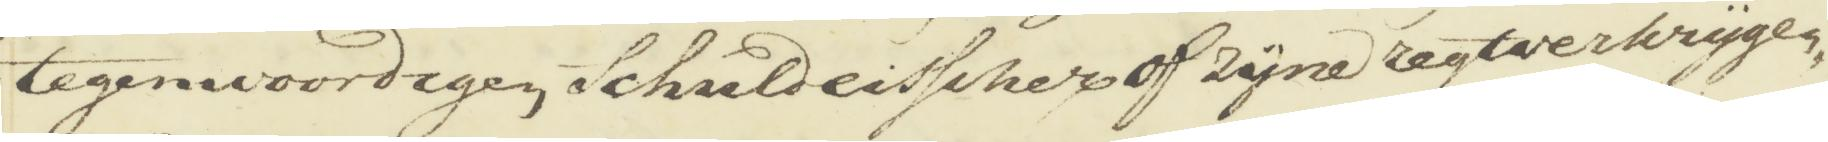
tegenwoordigen schuldeisscher of zijne regtverkrijgen„
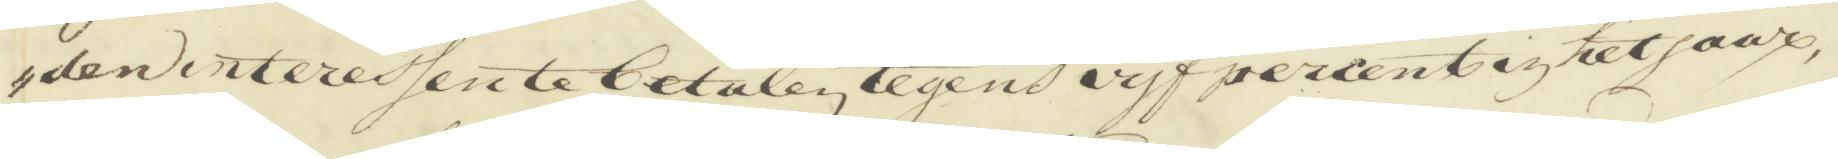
„den interessen te betalen tegens vijf percent in het jaar,
